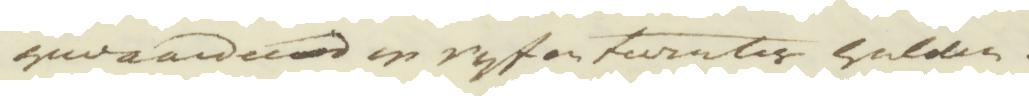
gewaardeerd op vyf en twintig Gulden
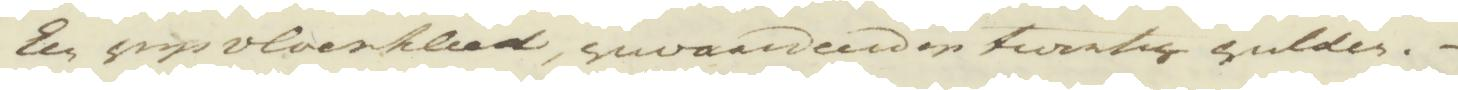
Een grys vloerkleed, gewaardeerd op twintig gulden.
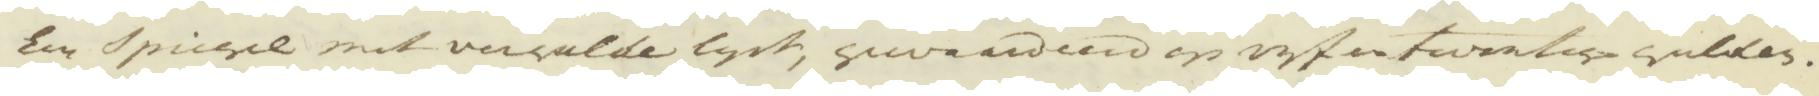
Een spiegel met vergulde lyst, gewaardeerd op vyf en twintig gulden
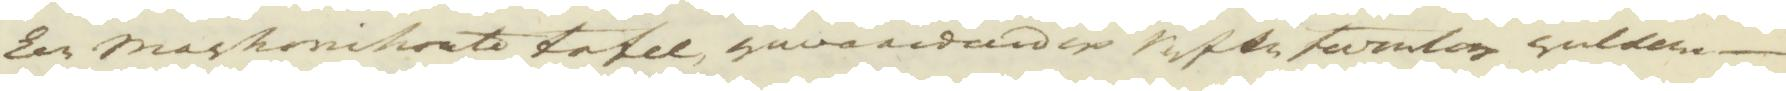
Een maghonihoute tafel, gewaardeerd op Vyf en twintig gulden —
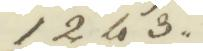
1243„
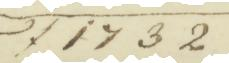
ƒ1732
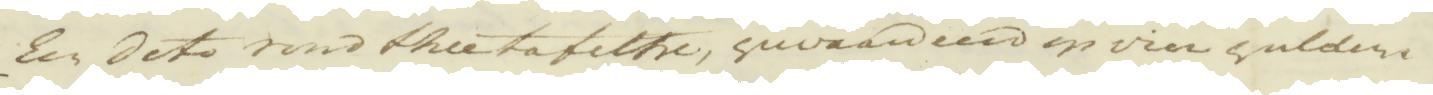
Een dito rond theetafeltje, gewaardeerd op vier gulden.
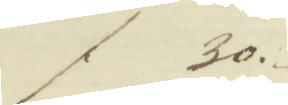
ƒ 30.
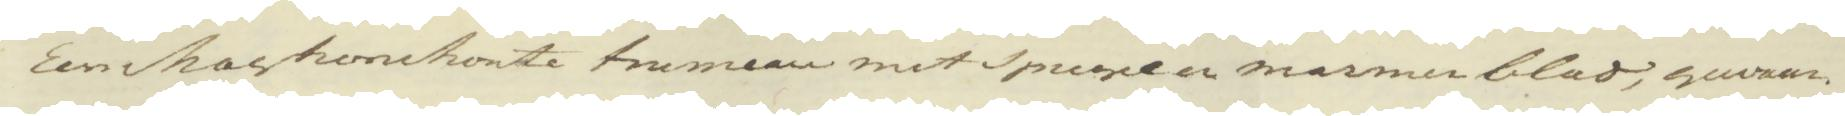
Een Maghonihoute trumeau met spiegel en marmer blad, gewaar.
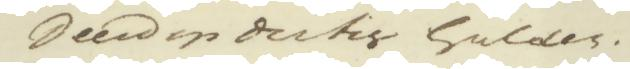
deerd op dertig Gulden.
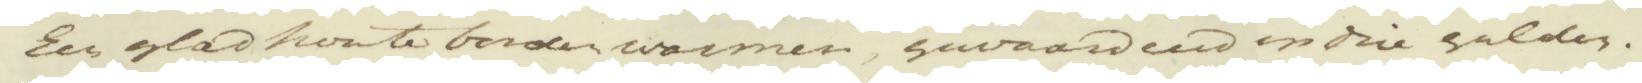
Een glad houte bordenwarmer, gewaardeerd op drie gulden.
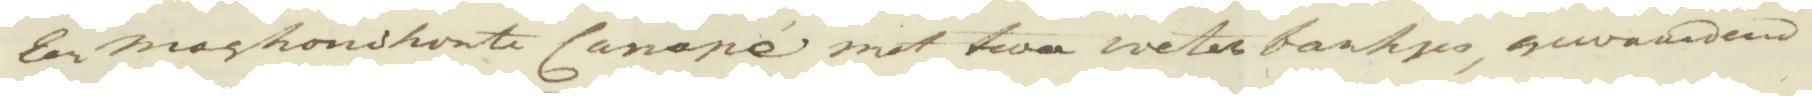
Een moghonihoute Canapé met twee voeten bankjes, gewaardeerd
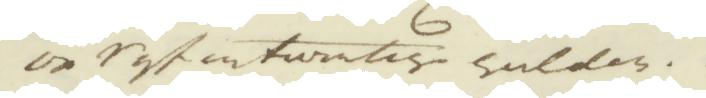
op Vyf en twintig gulden.
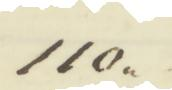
110„
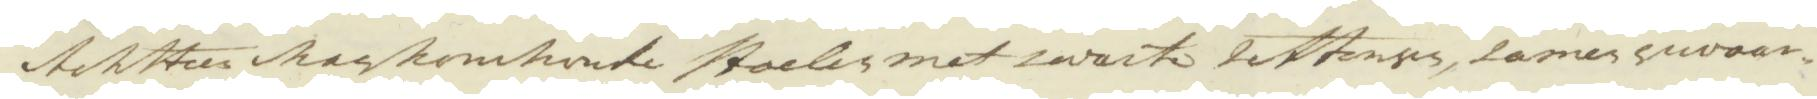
Achttien Maghonihoute stoelen met zwarte zittingen, zamen gewaar
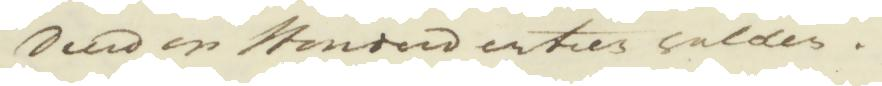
deerd en Honderd en tien gulden.
